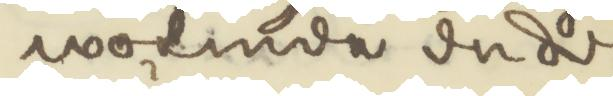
wormer en de
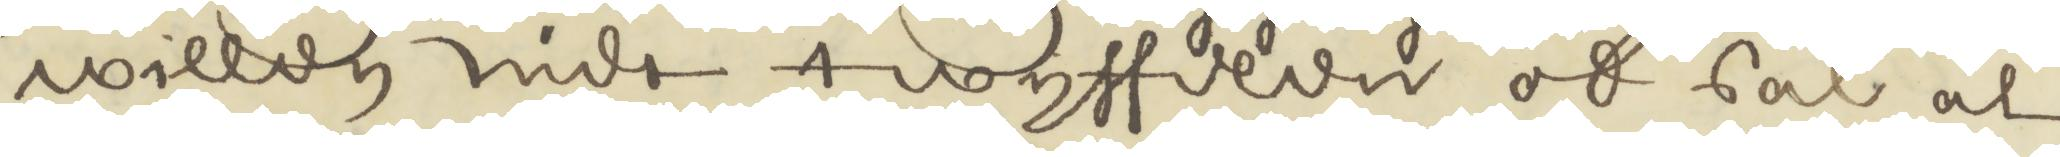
willen niet twijffelen of sal al
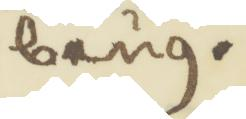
brug.
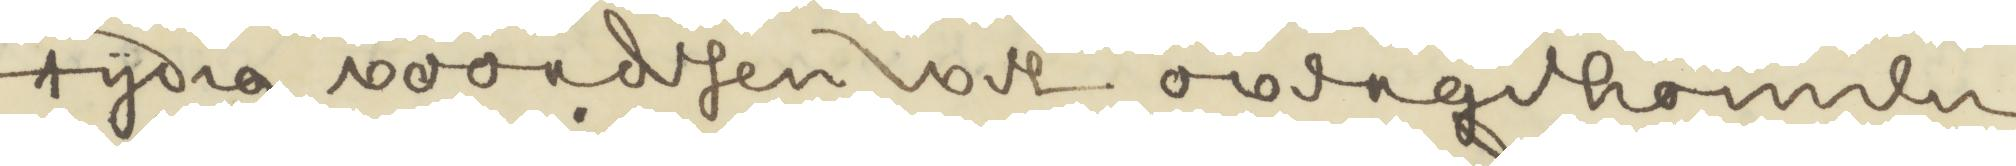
tijdig voor desen wel overgekomen
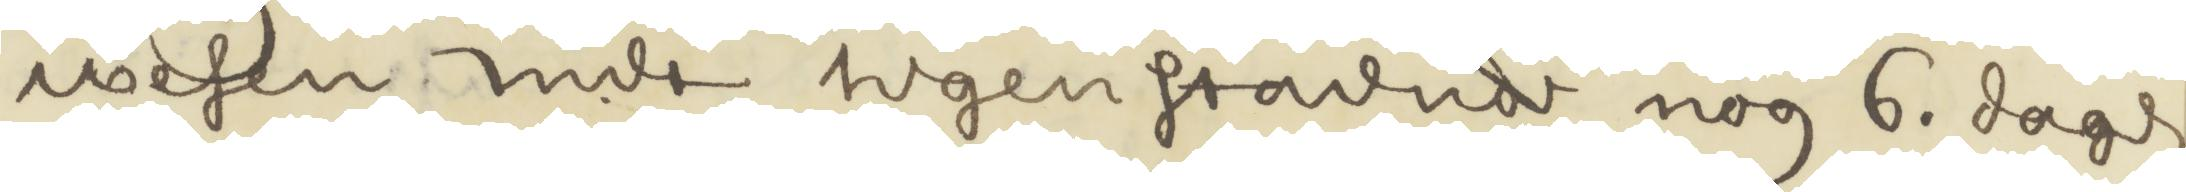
wesen niet tegenstaende nog 6. dagen
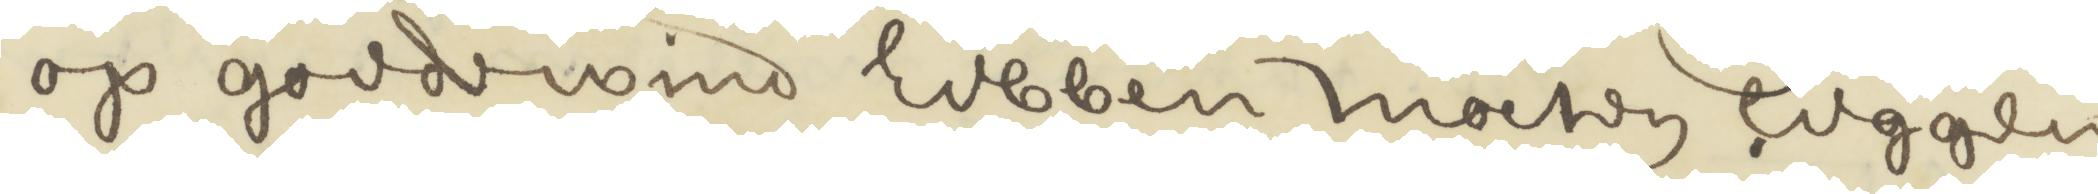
op goede wind hebben moeten leggen
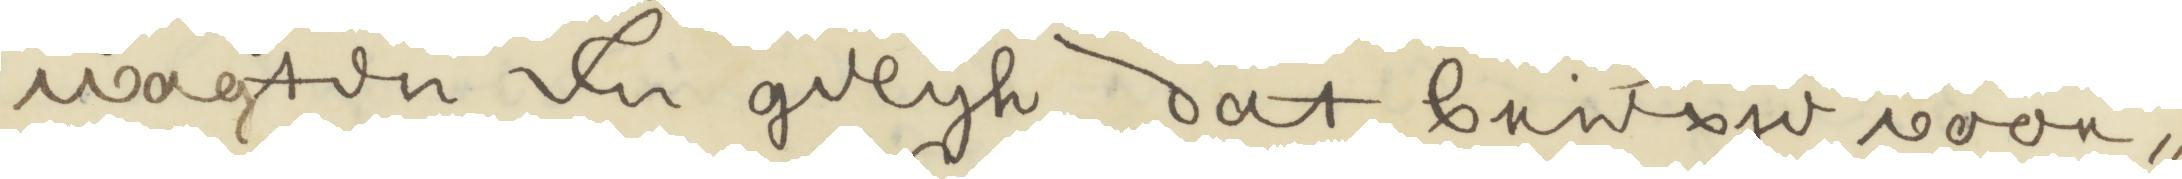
wagten En gelijk dat brievje voor„
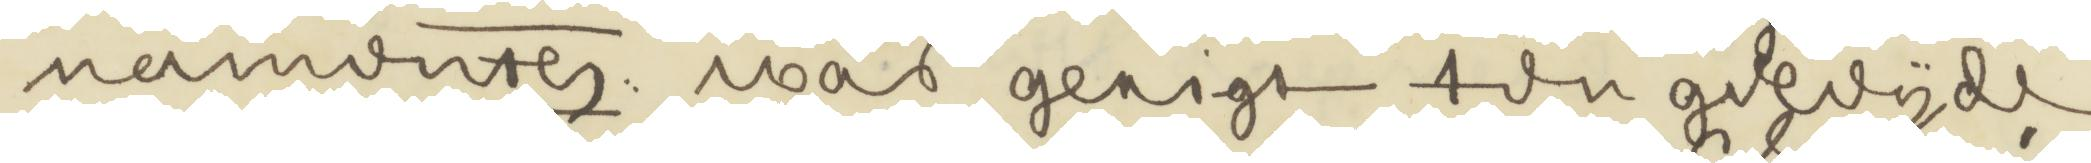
namentlijk was gerigt ten geleijde
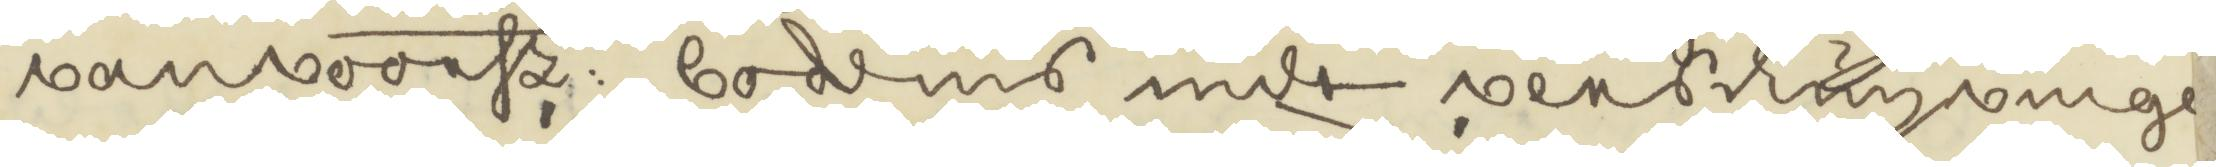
van voorsz: bodems met verschuijvinge
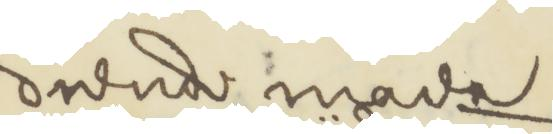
diende maer
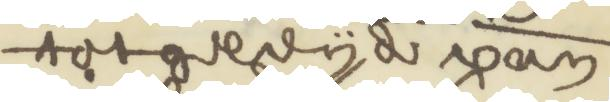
tot geleijde van
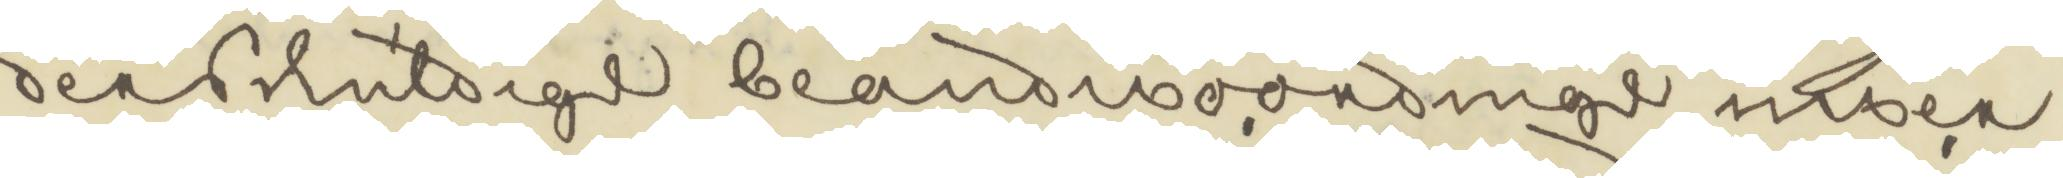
der schuldige beandwoordinge uwer
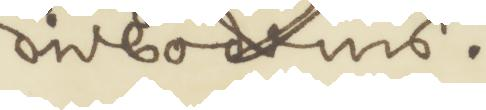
die bodems.
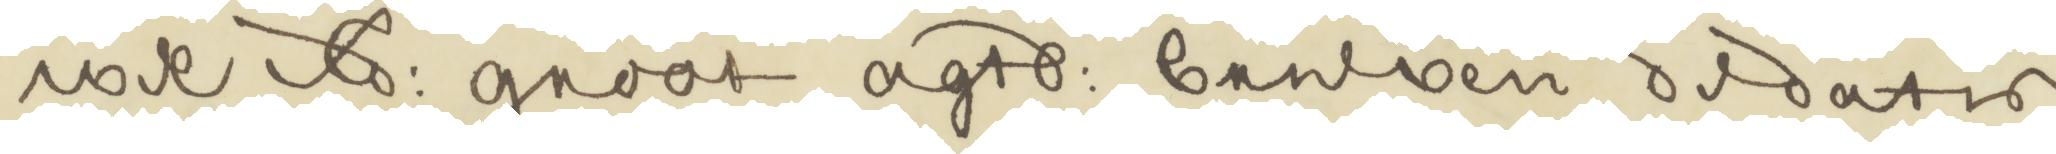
wel Ed: groot agtb: brieven de datis
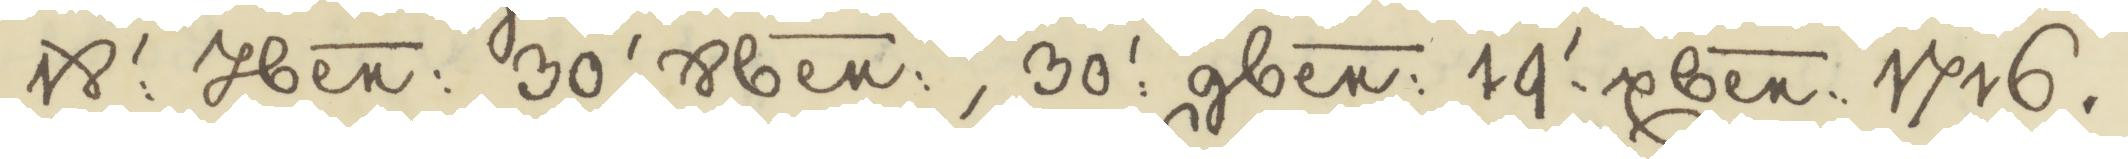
18:' 7ber: 30:' 8ber:, 30:' 9ber: 14:' xber: 1716.
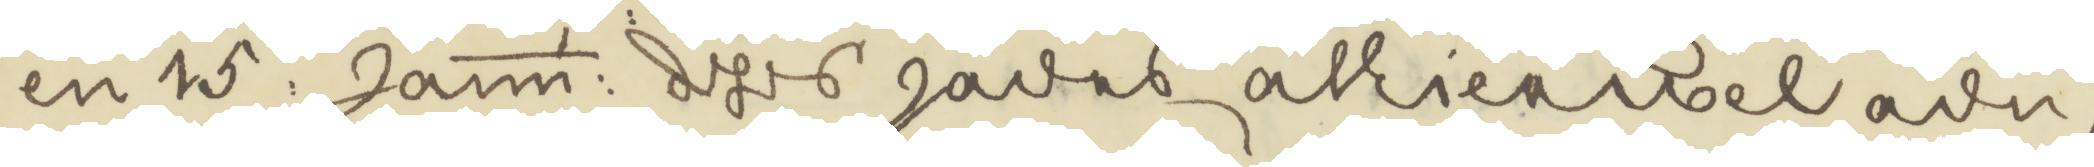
en 15:' Jann: deses jaers alhier wel aen„
